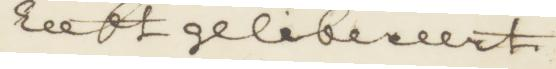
heeft gelibereert
